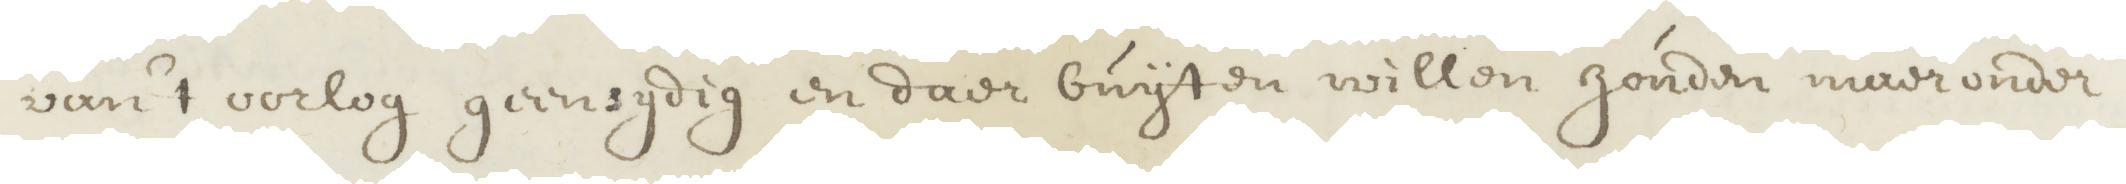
van ’t oorlog geensijdig en daer buijten willen houden maer onder
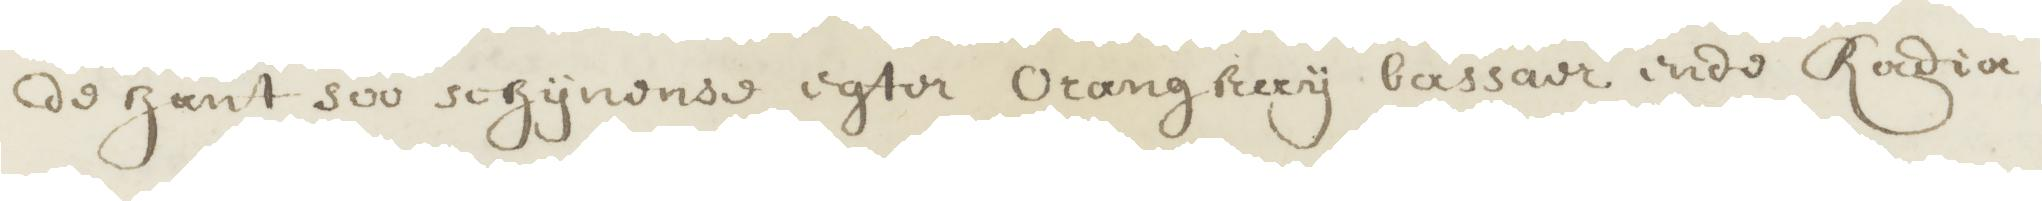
de hant soo schijnense egter Orangkaij bassaer ende Radia
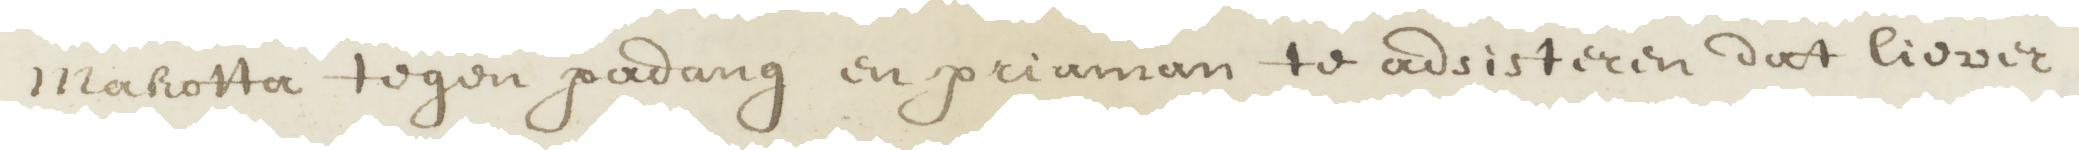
Makotta tegen padang en priaman te adsisteren dat liever
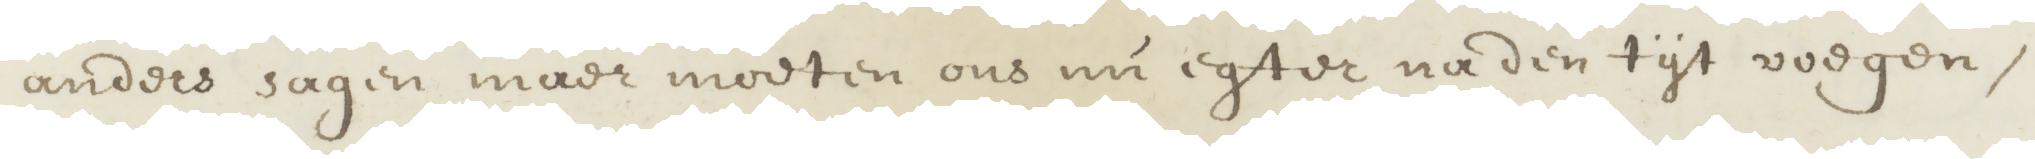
anders sagen maer moeten ons nu egter na den tijt voegen,
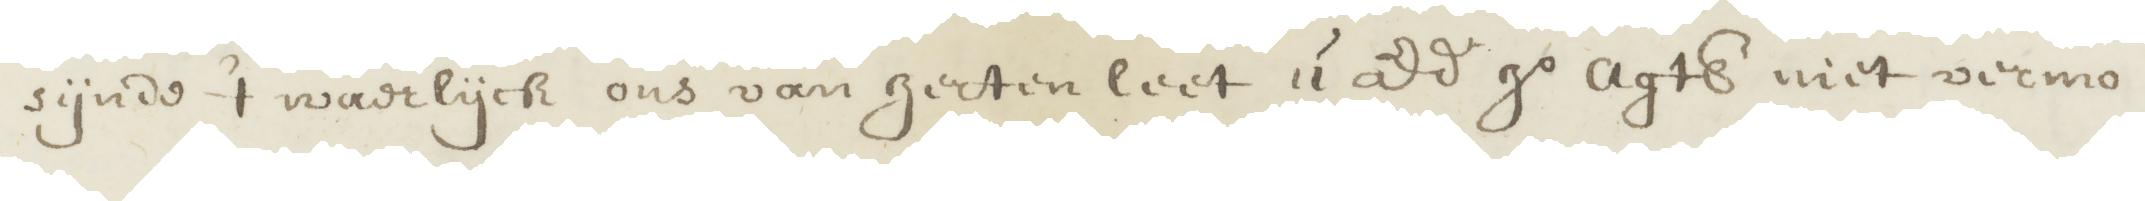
sijnde ’t waerlijck ons van herten leet u Ed ho Agtb niet vermo
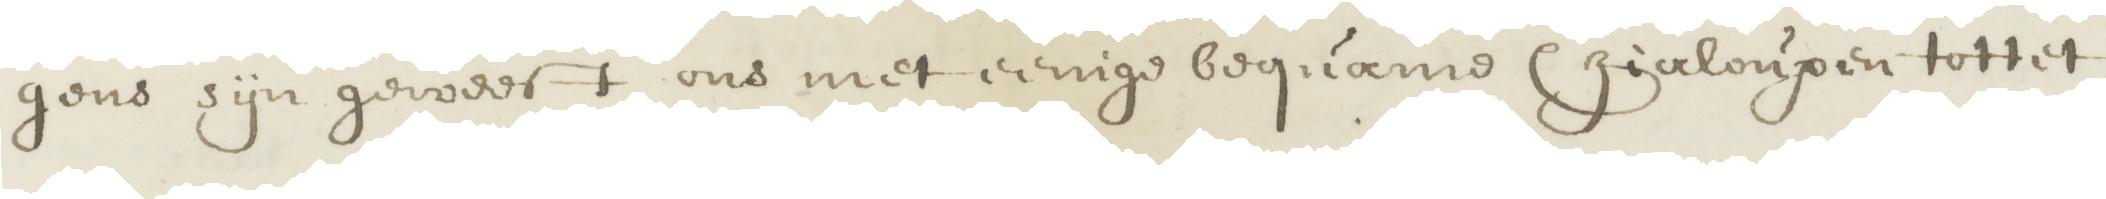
gens sijn geweest ons met eenige bequame chialoupen tottet
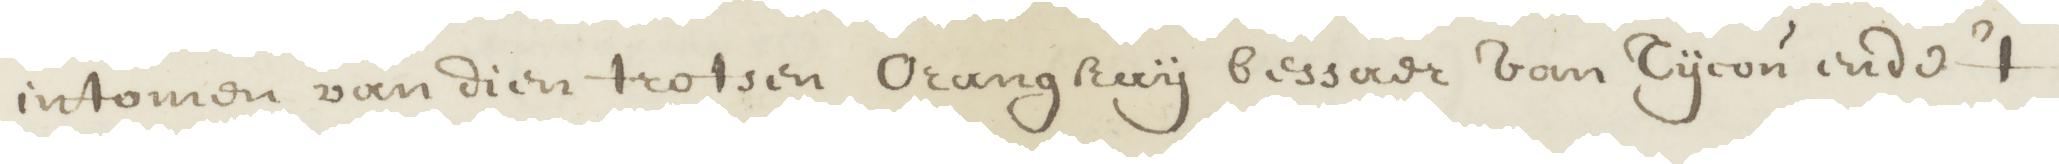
intomen van dien trotsen Orangkaij bessaer van Tijcou ende ’t
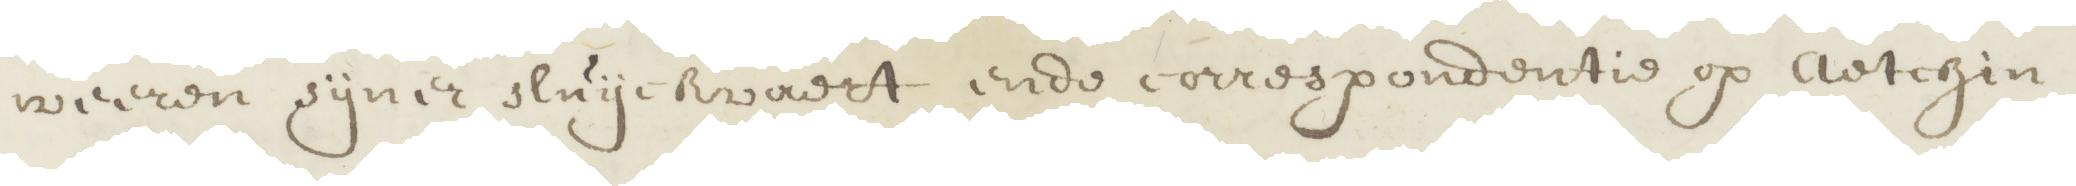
weeren sijner sluijckvaert ende correspondentie op Aetchin
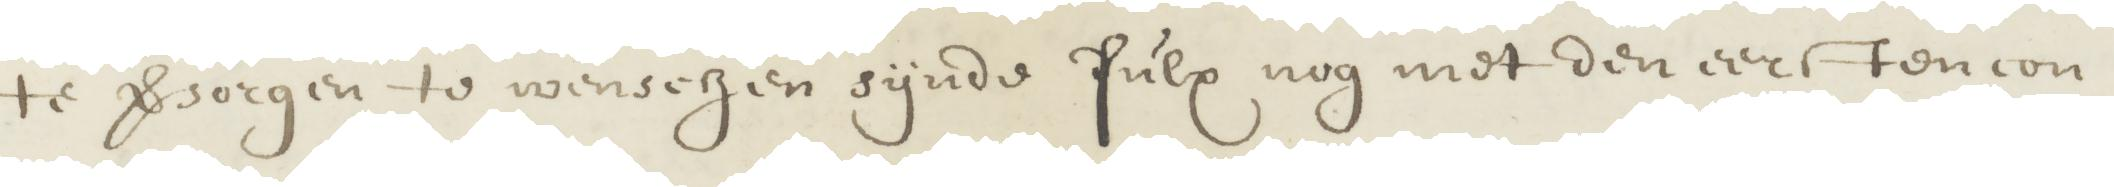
te versorgen te wenschen sijnde sulx nog met den eersten con
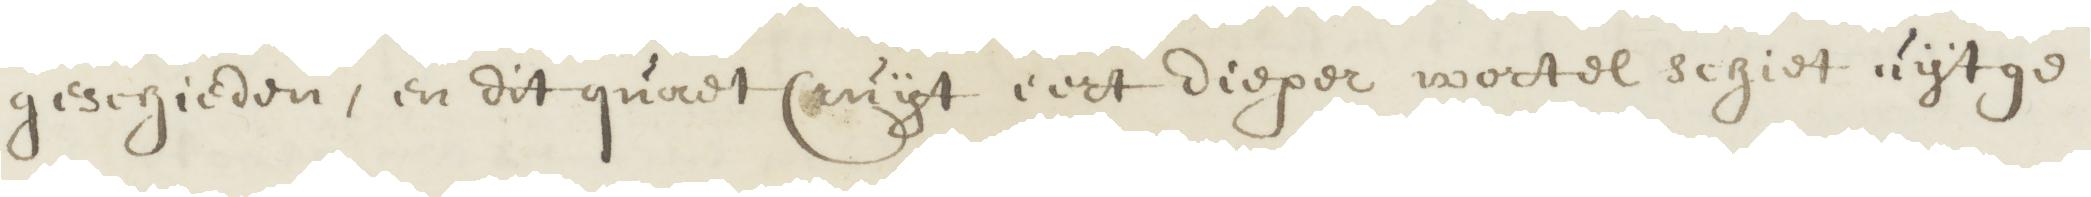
geschieden, en dit quaet cruijt eert dieper wortel schiet uijtge
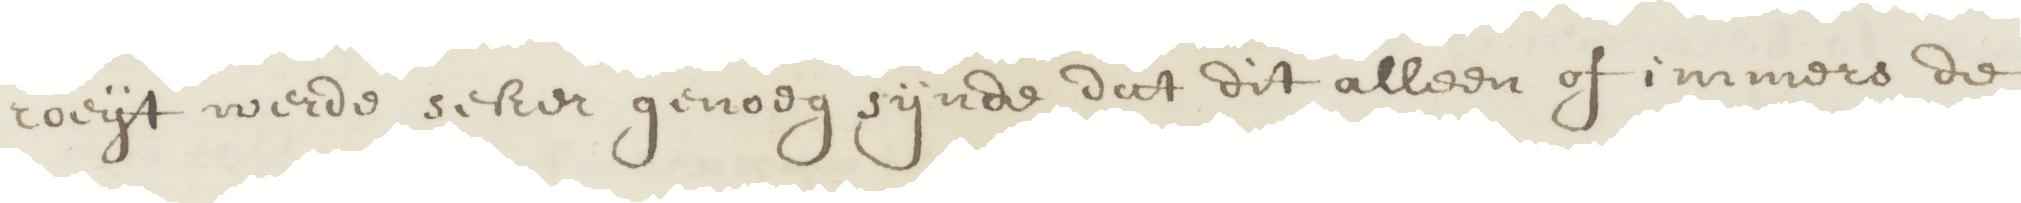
roeijt werde seker genoeg sijnde dat dit alleen of immers de
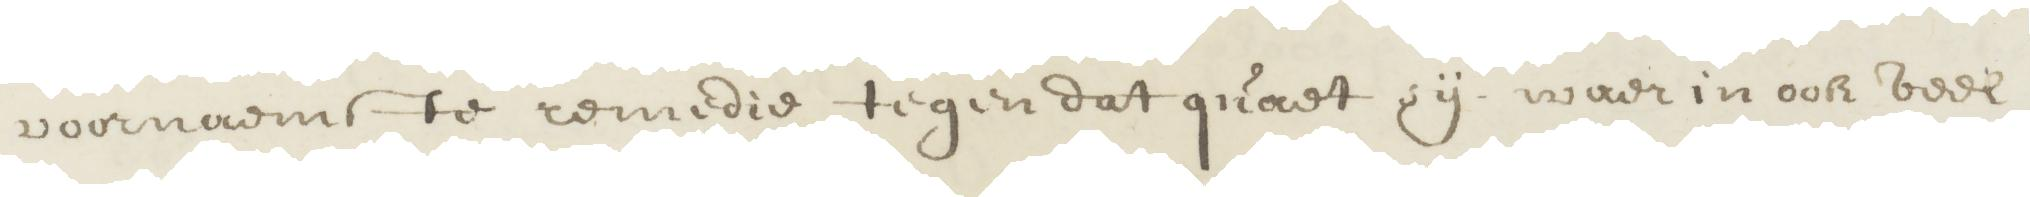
voornaemste remedie tegen dat quaet sij waer in ook veel
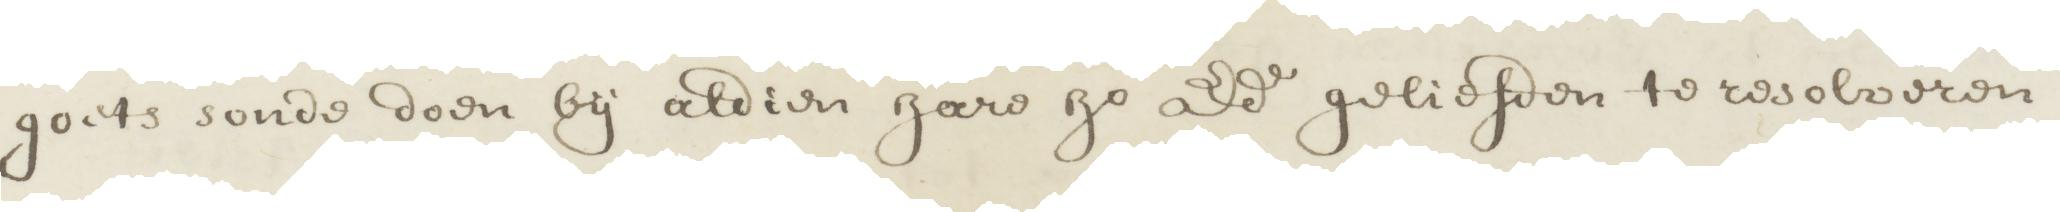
goets sonde doen bij aldien hare ho Ede geliesden te resolveren
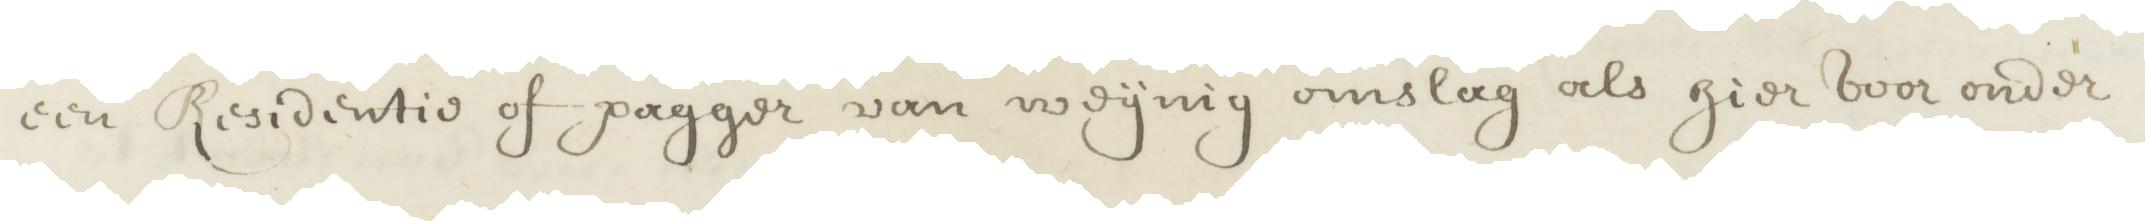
een Residentie of pagger van weijnig omslag als hier voor onder
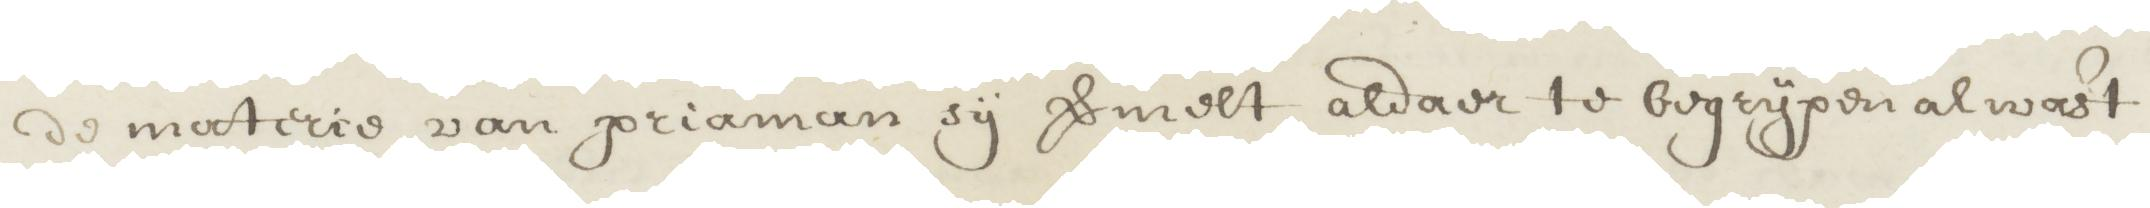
de materie van priaman sij vermelt aldaer te begrijpen al was’t
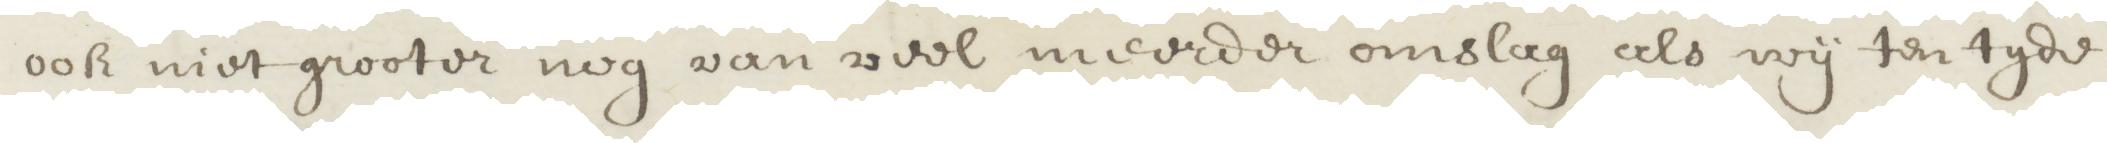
ook niet grooter nog van veel meerder omslag als wij ten tijde
